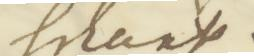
scharp.
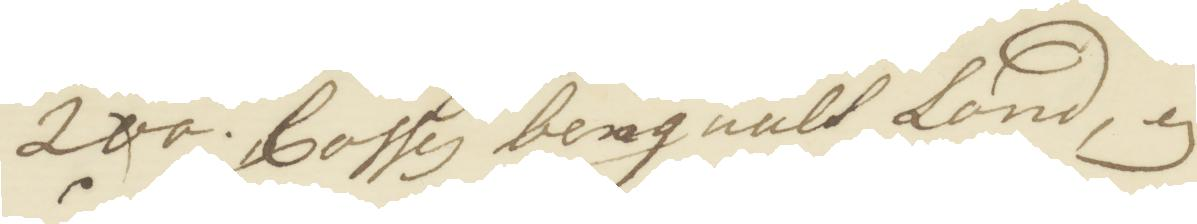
200: bossen bengaals Lond, en
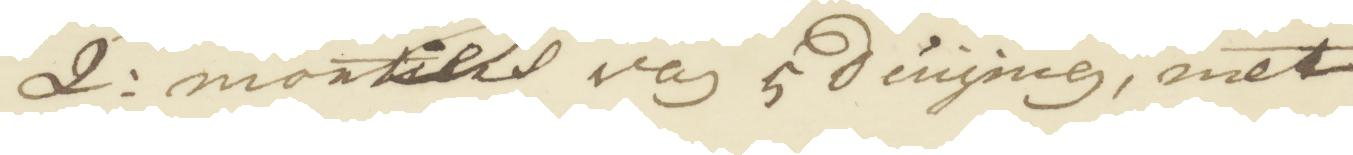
2: mortiers van 5 duiijmen, met
